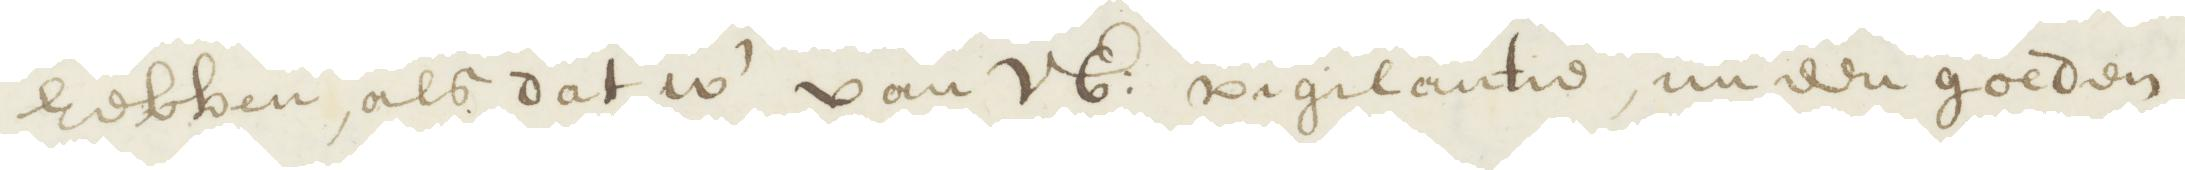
hebben, als dat w' van VE: vigilantie, nu een goeden
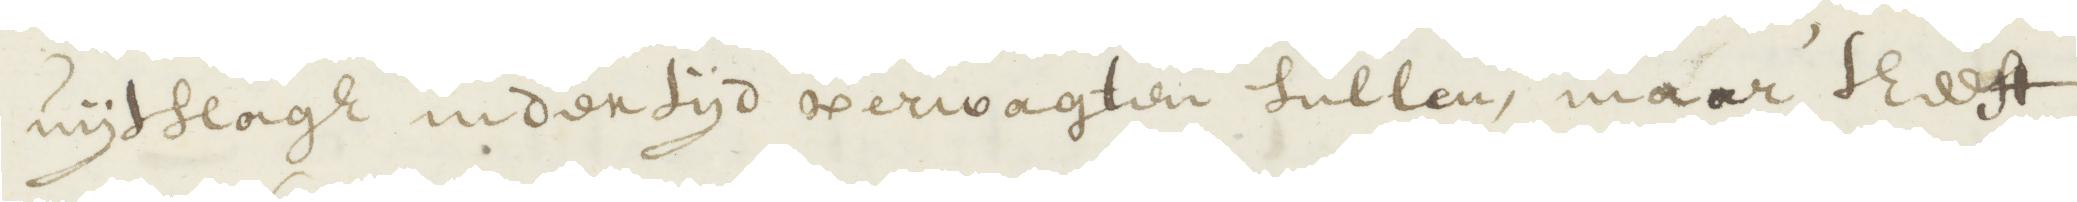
uijtslagh inder tijd verwagten sullen, maar 'theeft
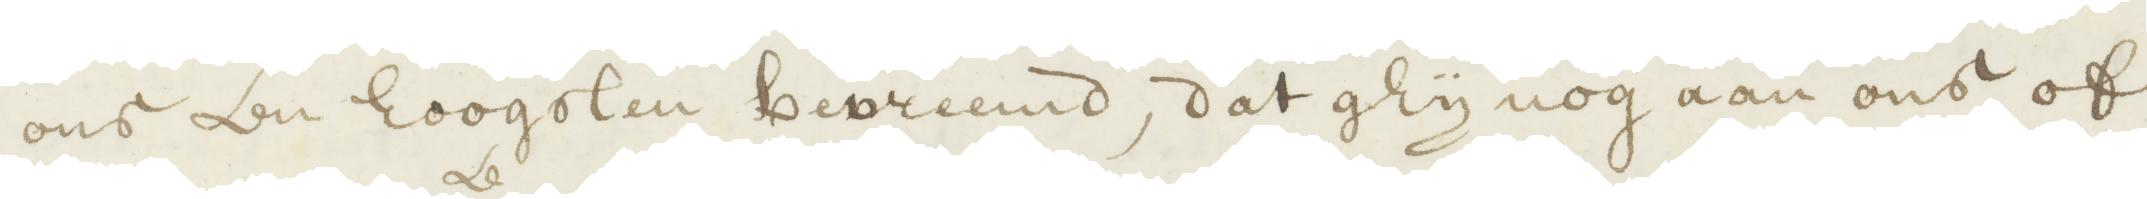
ons ten hoogsten bevreemd, dat ghij nog aan ons of
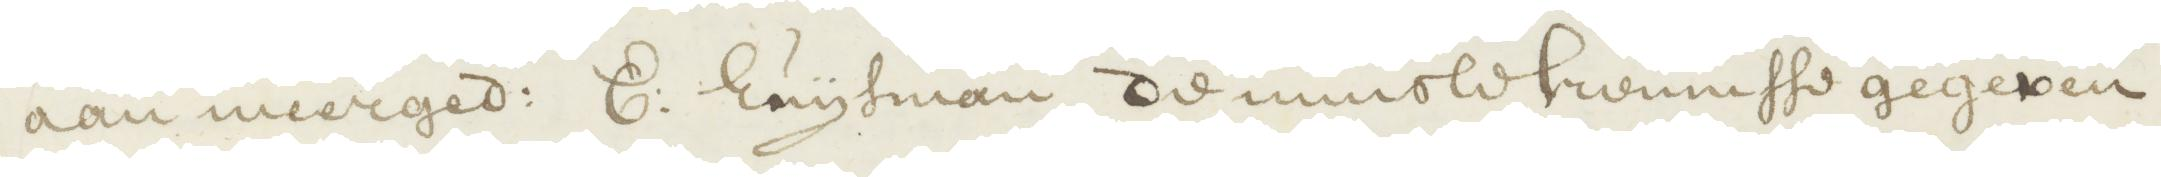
aan meerged:te E: huijsman de minste kennisse gegeven
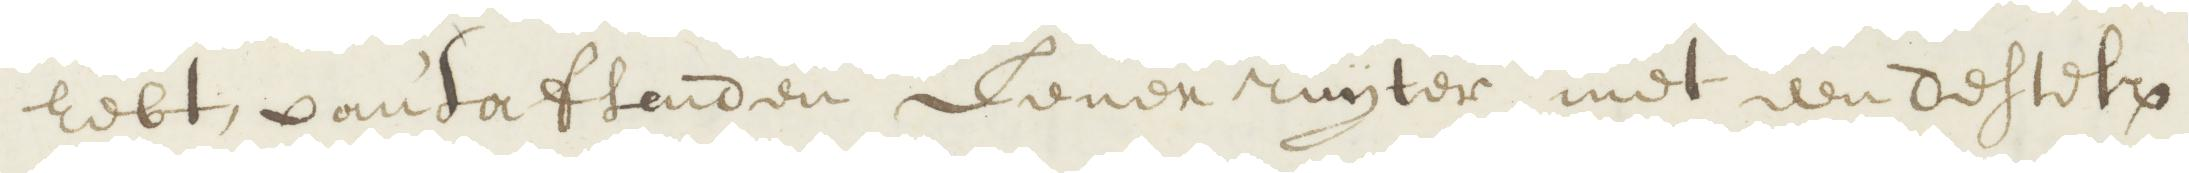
hebt, van't afsenden Eener ruijter met een destek
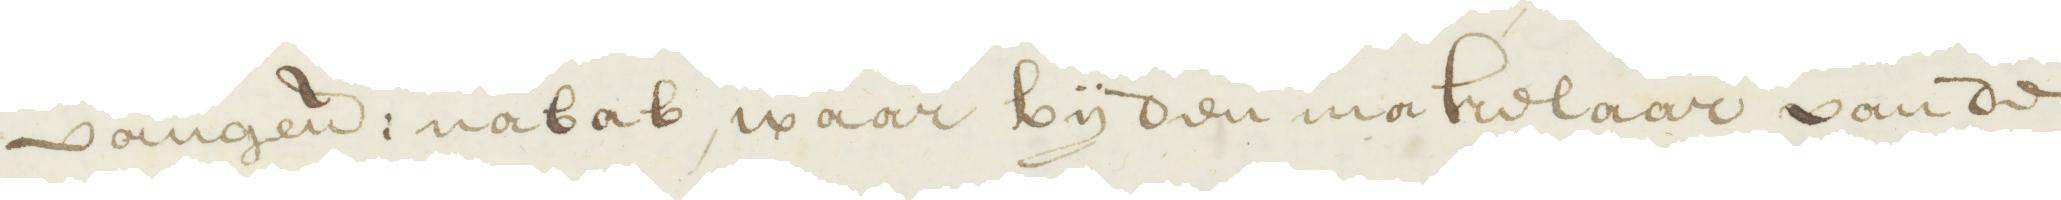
van gen: nabab, waar bij den makelaar van de
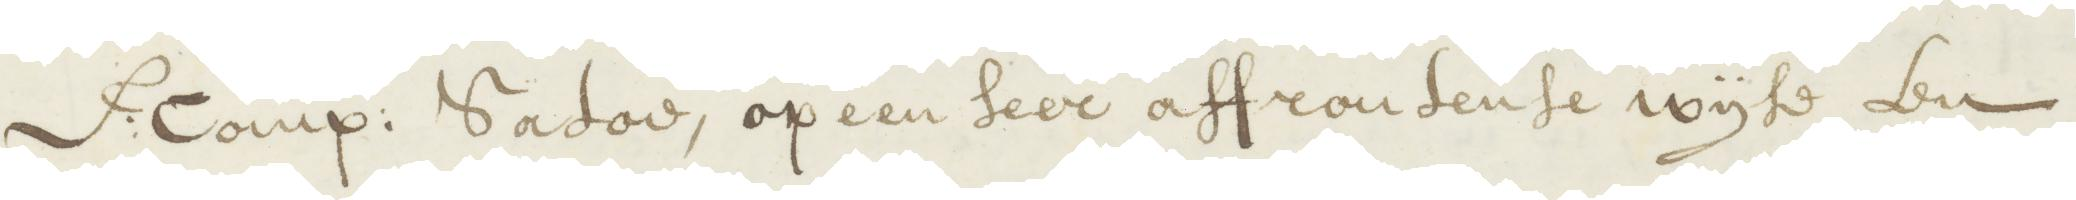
E: Comp: Satoe, op een seer affronteuse wijse ten
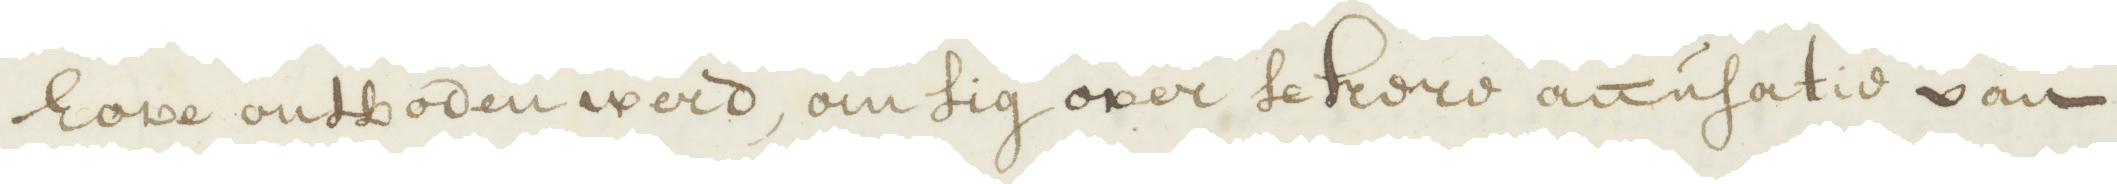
hove ontboden werd, om sig over sekere accusatie van
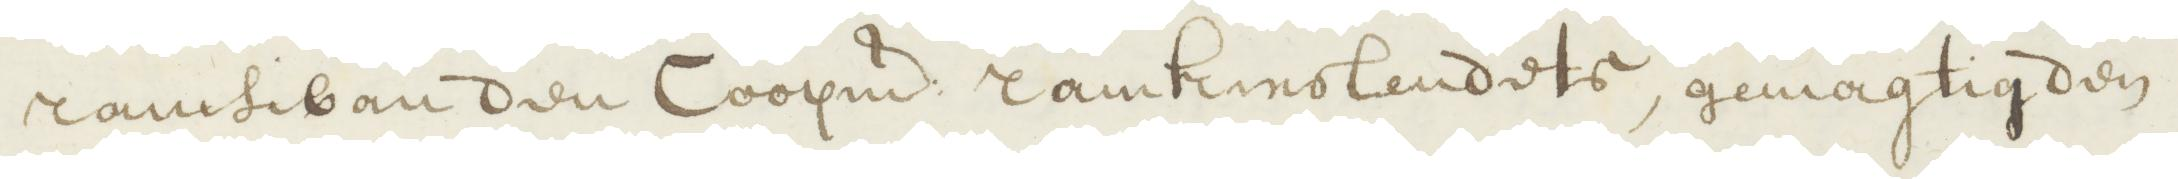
ramsiban den Coopm: ramkirstendets, gemagtig den
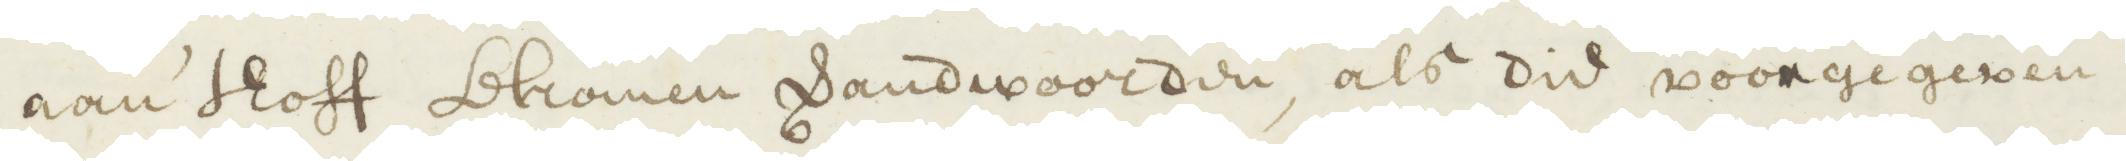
aan ’t hoff tekomen verandwoorden, als die voorgegeven
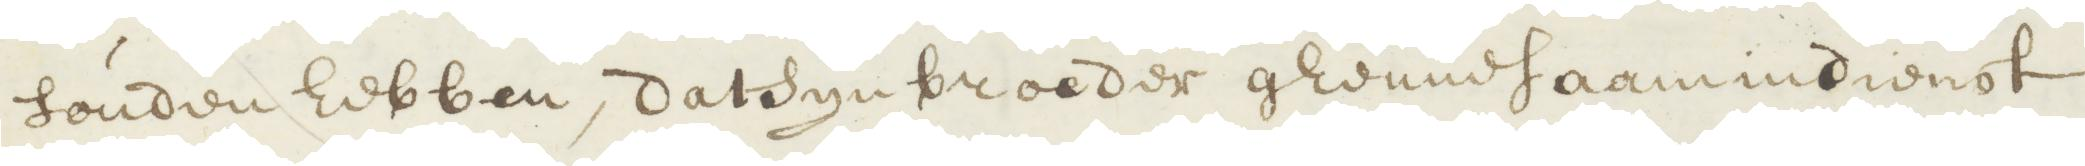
souden hebben, dat syn broeder ghennesaam in dienst
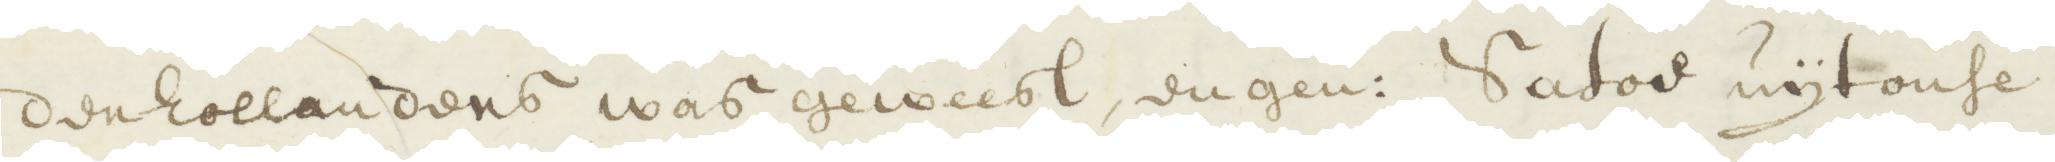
der hollanders was geweest, en gen: Satoe uijt onse
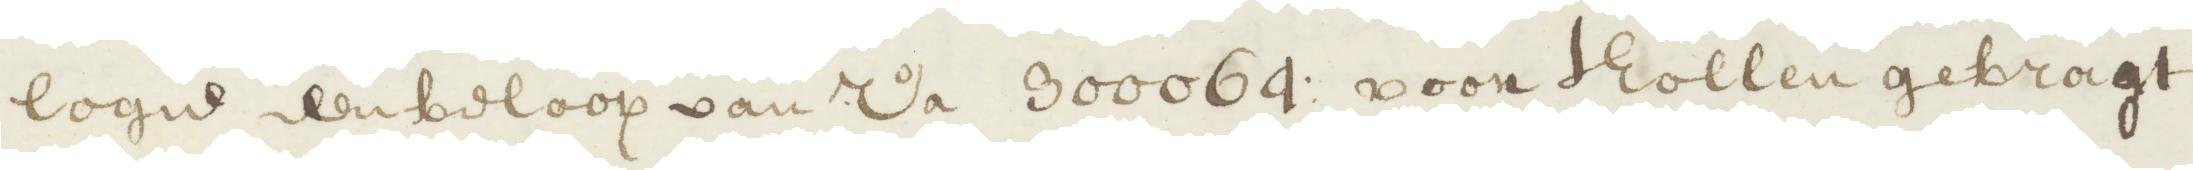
logie een beloop van r: o/a 300064: voor thollen gebragt
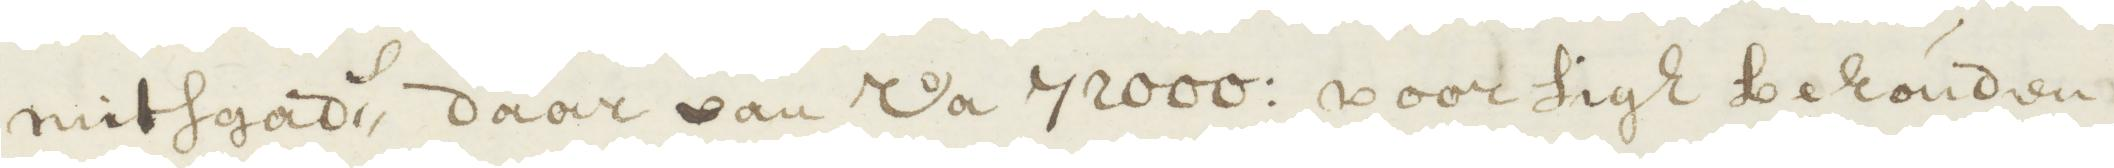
mitsgad„s daar van r:o/a 72000: voor sigh behouden
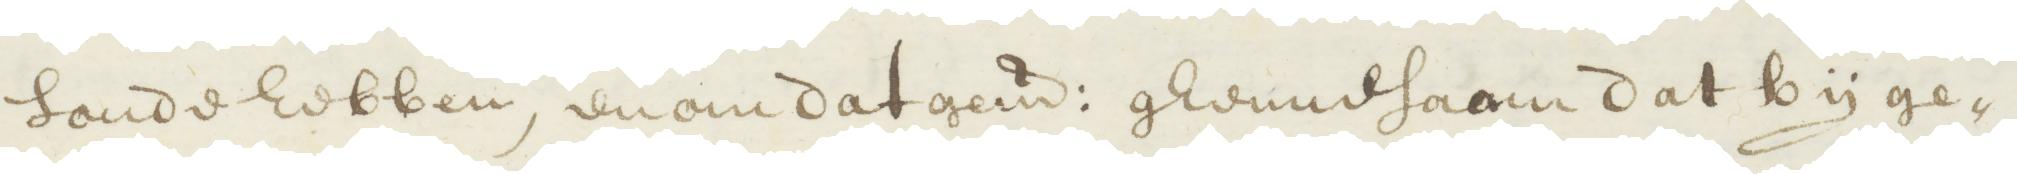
soude hebben, en om dat gem: ghennesaam dat bij ge„
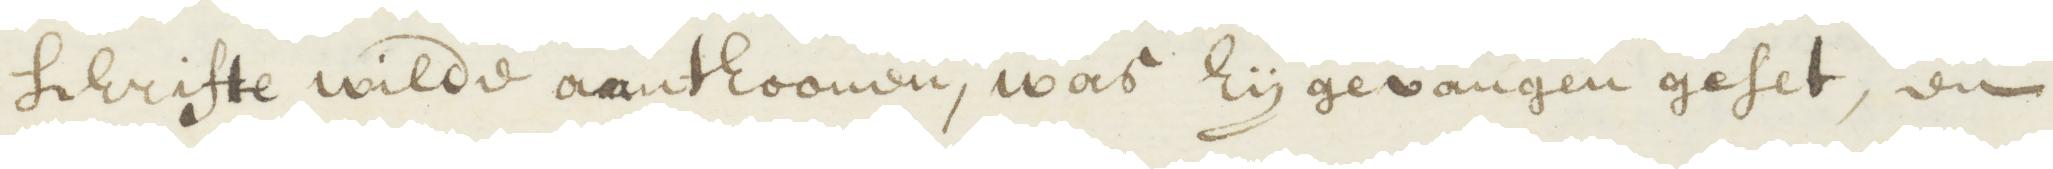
schrifte wilde aanthoonen, was hij gevangen geset, en
